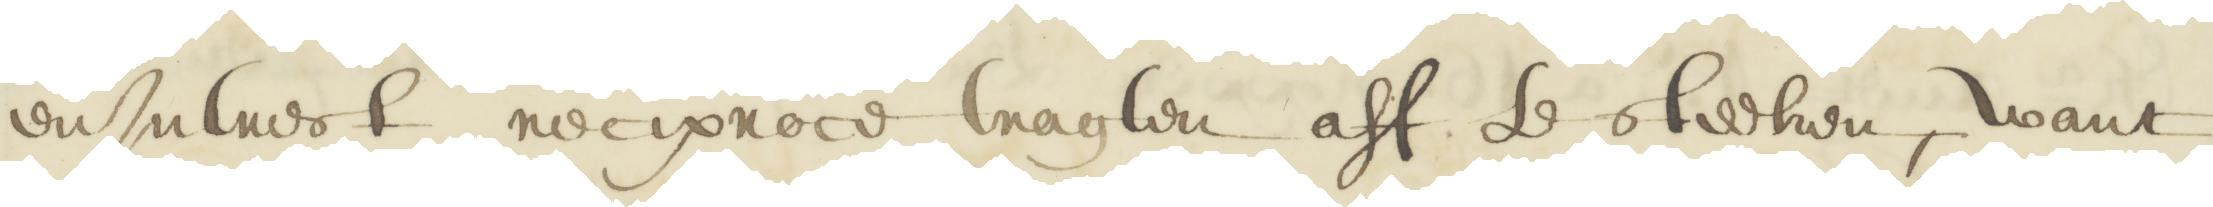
en intrest reciproce tragten aff te steeken, want
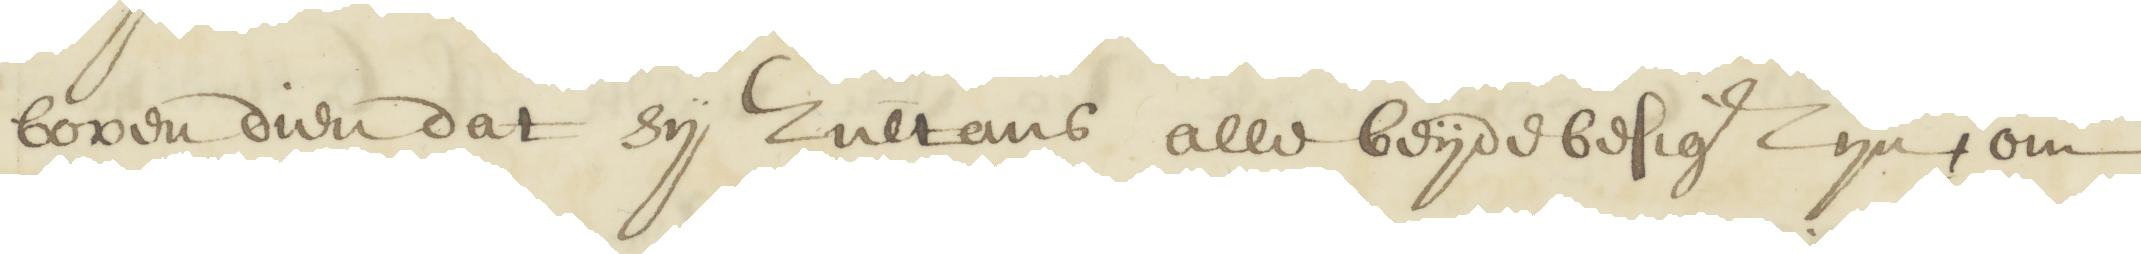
boven dien dat sij zultans alle beijde besig zijn, om
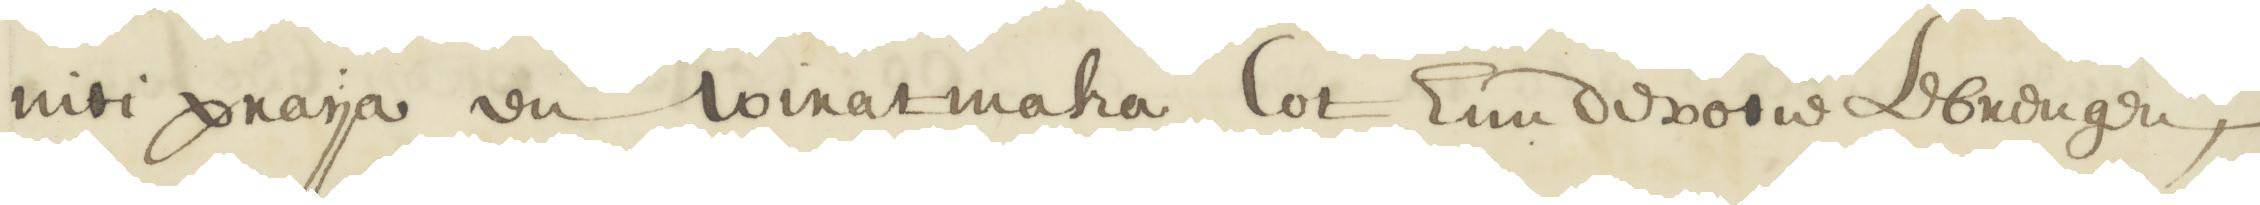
niti praija en wiratmaka tot hun devotie te brengen,
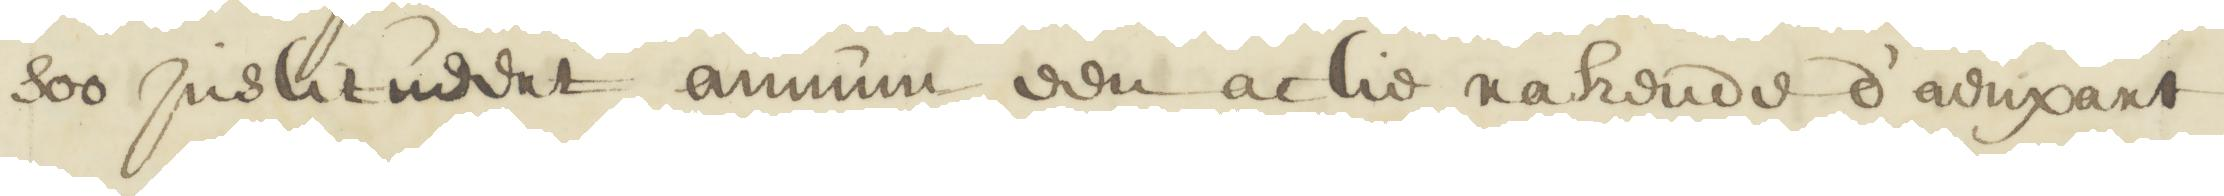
soo justitueert annum een actie rakende d’ aenpart
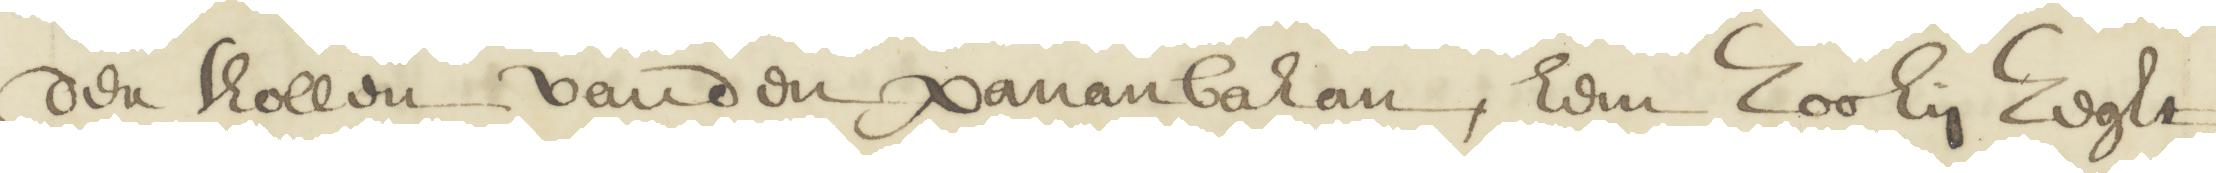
der thollen van den pananbahan, hem zoo hij zeght
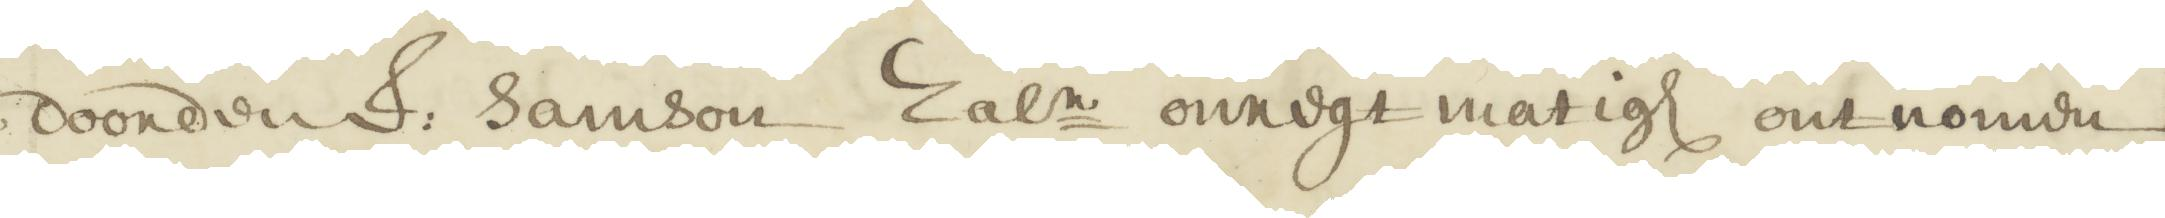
door den E: Samson zal=r onregt matigh ontnomen
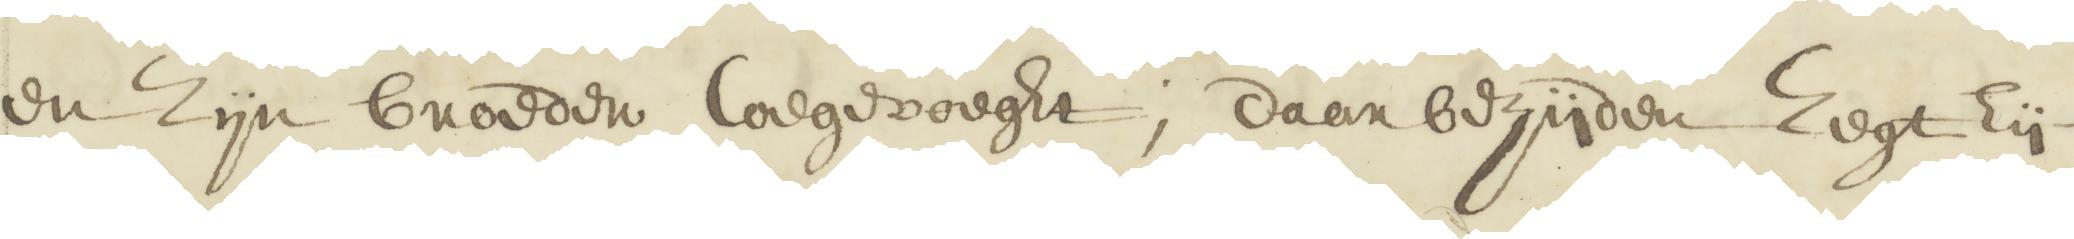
en zijn broeder toegevoeght; daar bezijden zegt hij
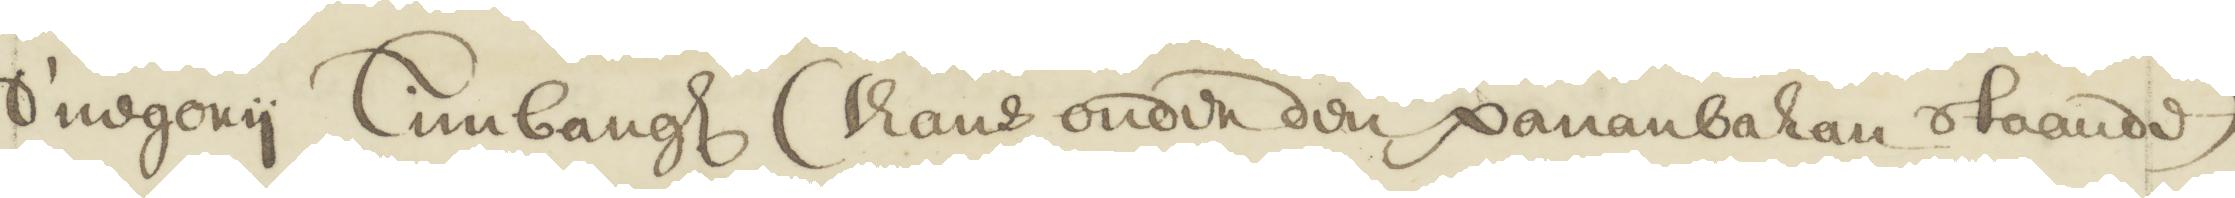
d'negorij Timbangh (thans onder den pananbahan staande)
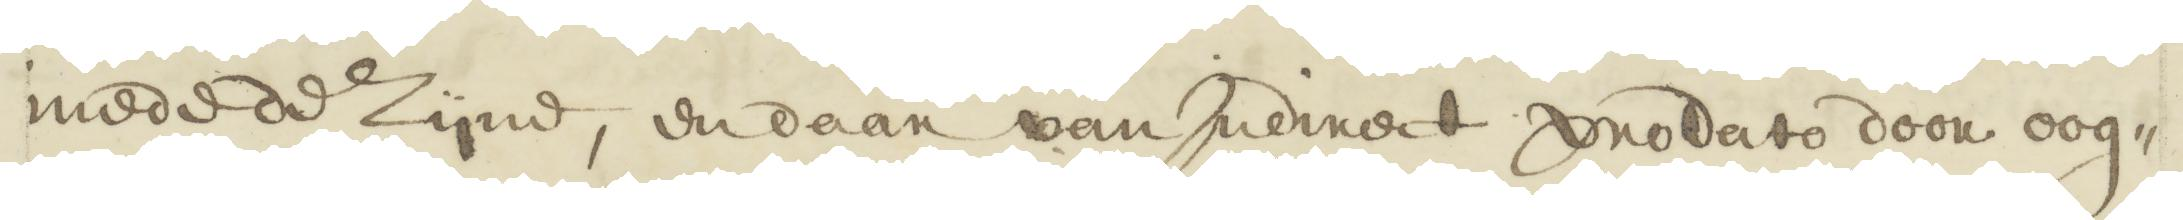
mede de zijne, en daar van Indirect pro dato door oog„
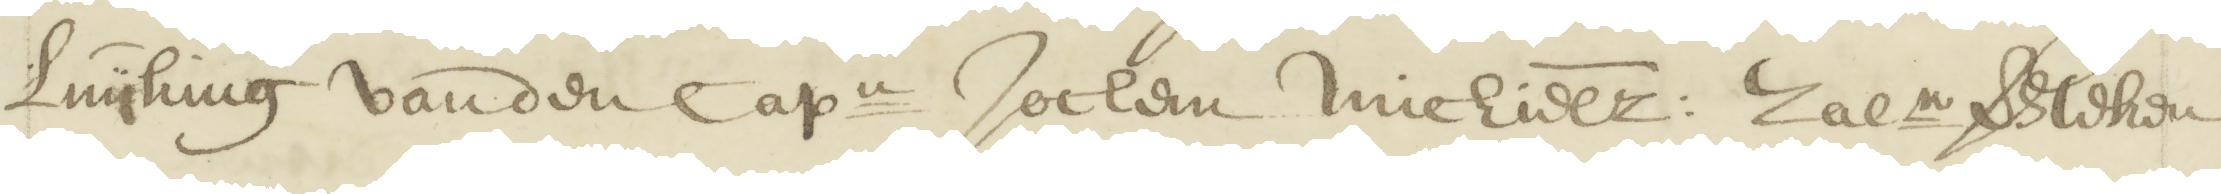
luijking van den Cap=n Jochem: michielz: zal=r versteken
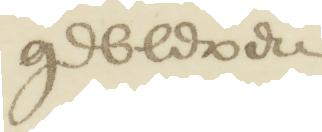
gebleven
